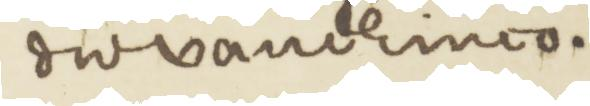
die van chinco.
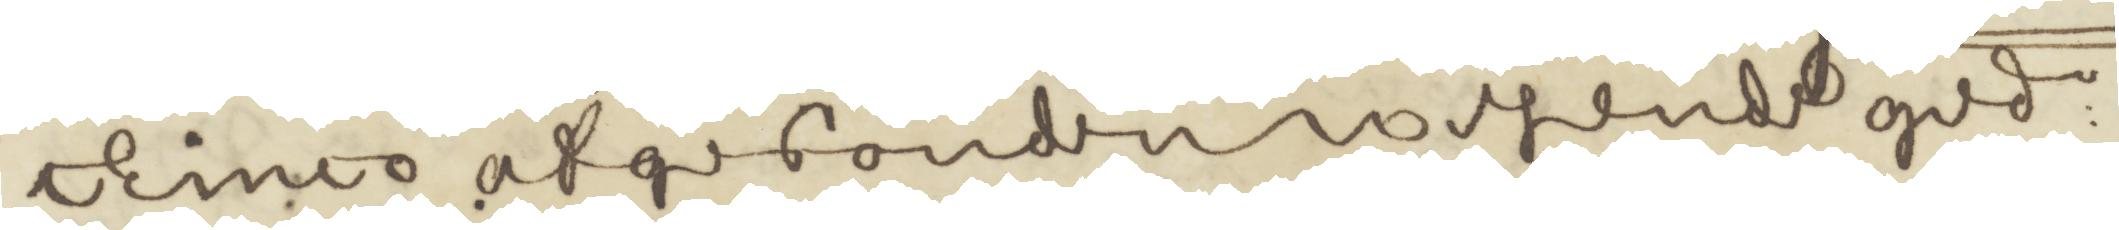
Chinco afgesonden wesende ged:e
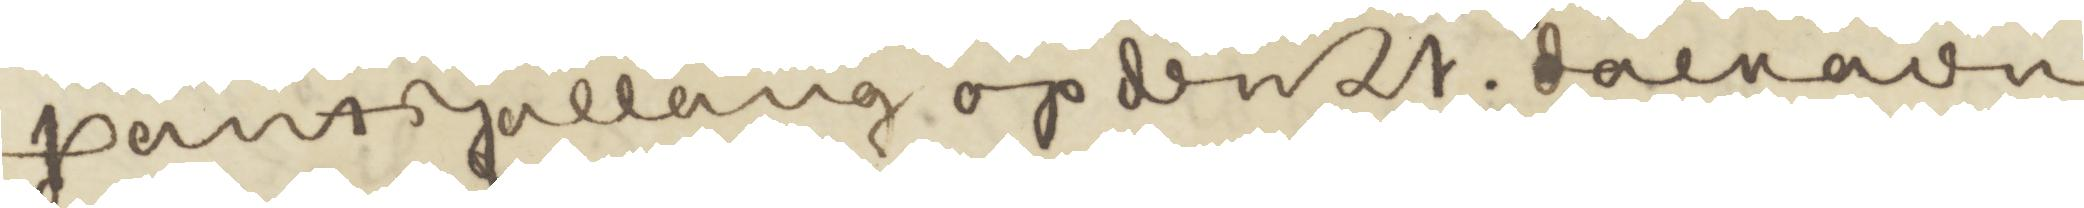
pantsjallang op den 21. daeraen
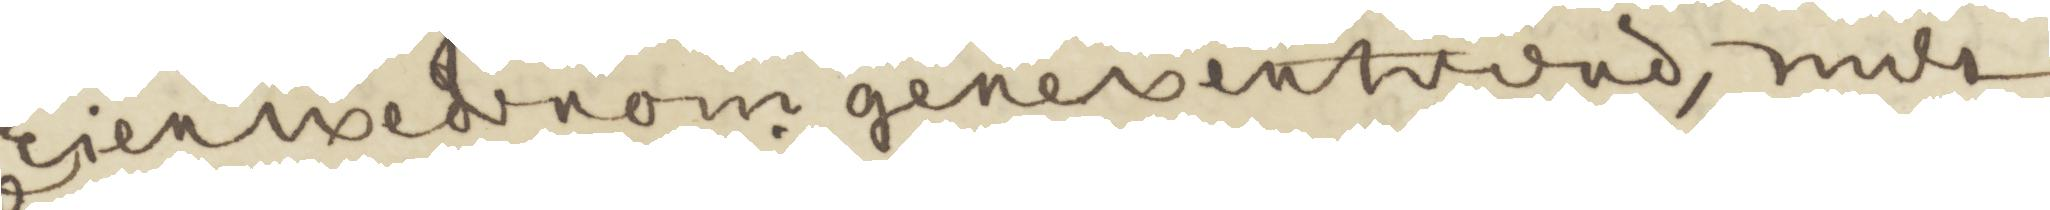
hier wederom gereverteerd, met
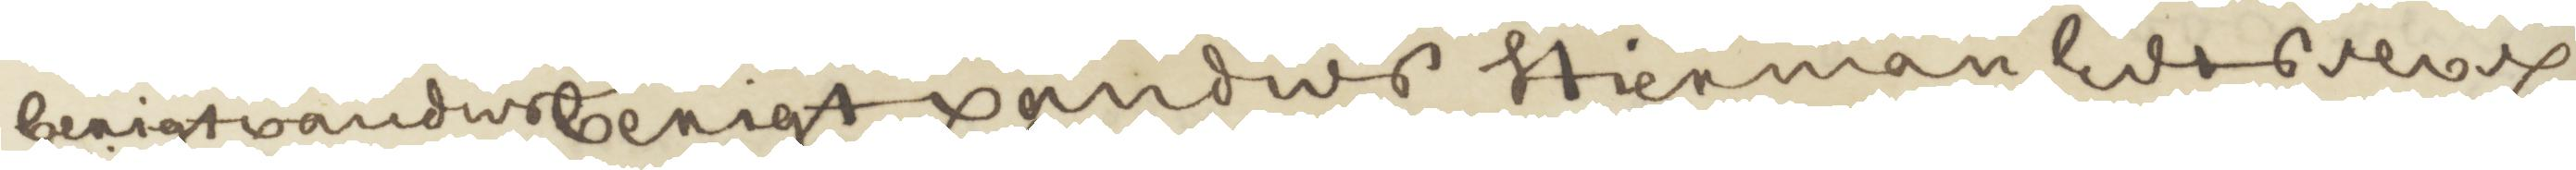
berigt van dies berigt van dies stierman het selve
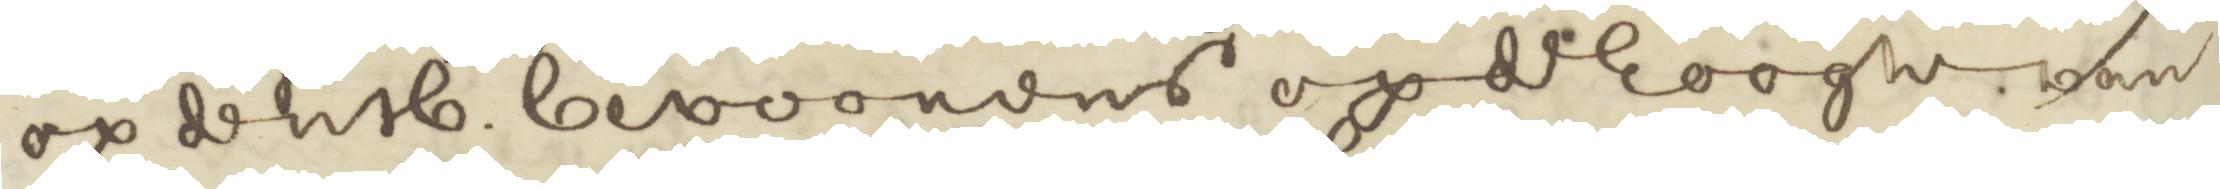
op den 16. bevoorens op de hoogte van
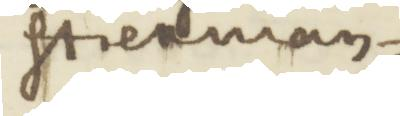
stierman
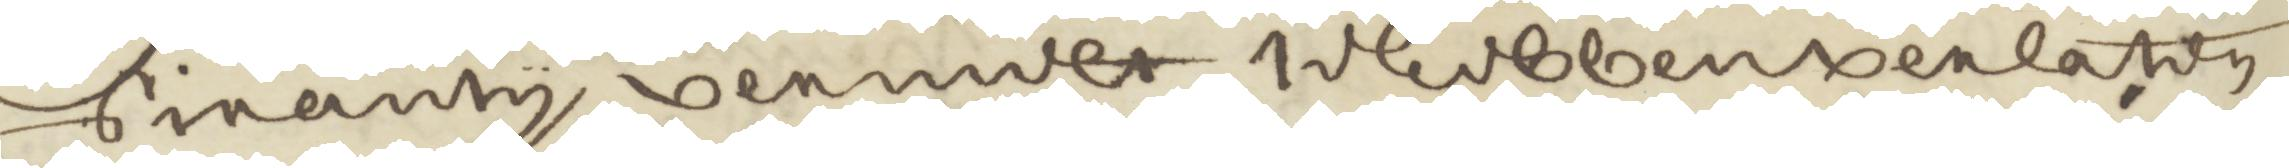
sirantij vermelt te hebben verlaten
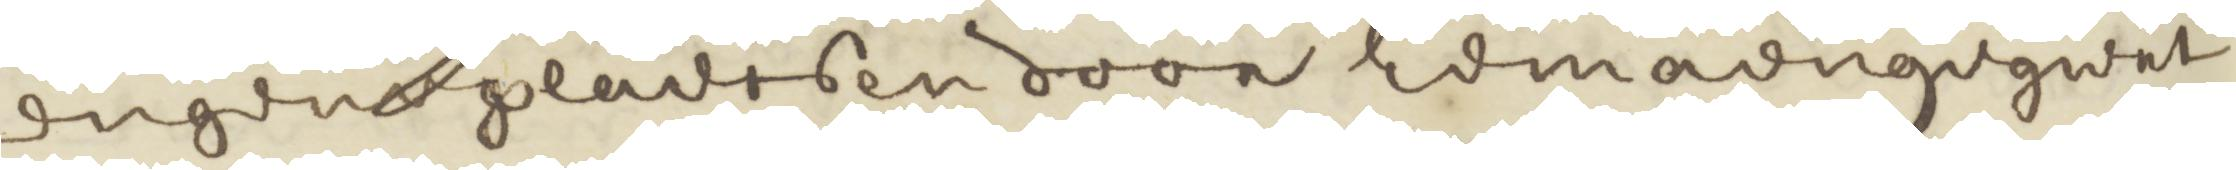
en gene plaetsen door hem aengegiert
